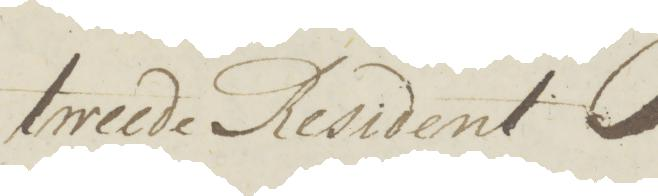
tweede Resident
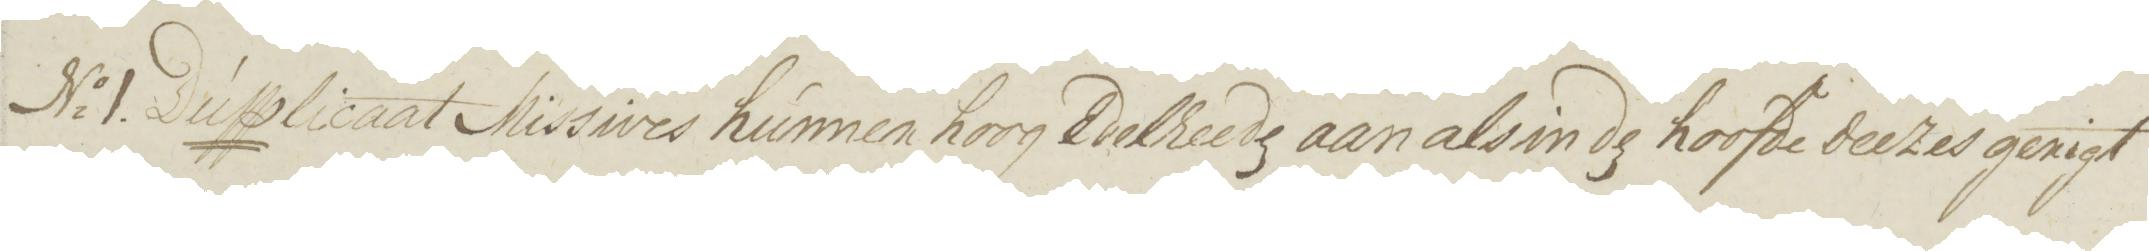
N=o 1. Dupplicaat Missives hunnen hoog Edelheeden aan als in den hoofde deezes gerigt
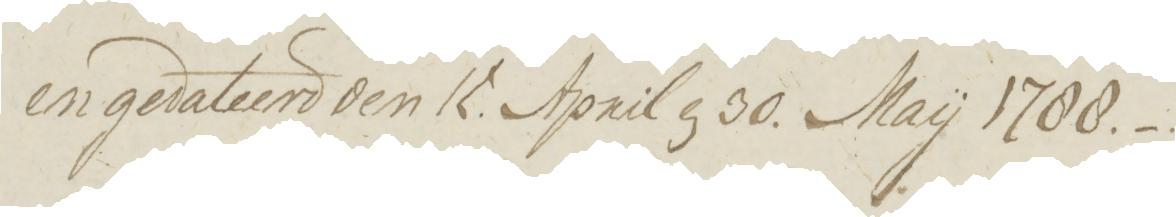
en gedateerd den 15. April en 30. Maij 1788.-
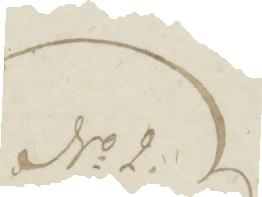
N=o 2.
